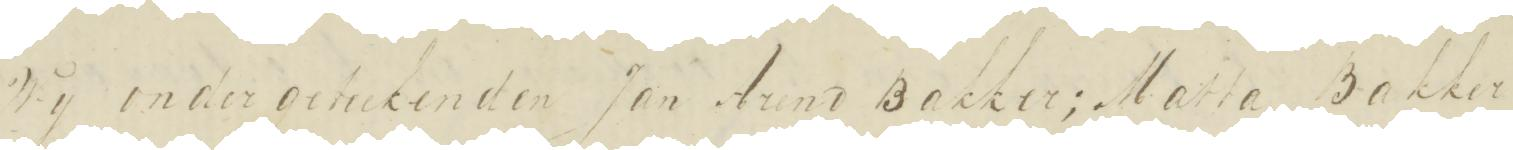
Wy ondergeteekenden Jan Arend Bakker: Maria Bakker
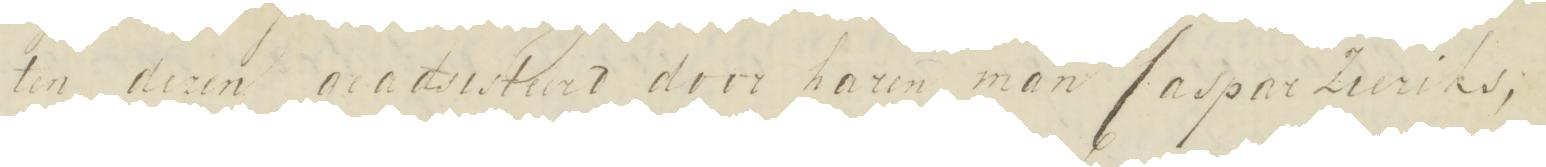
ten dezen geadsisteerd door haren man Caspar Zieriks;
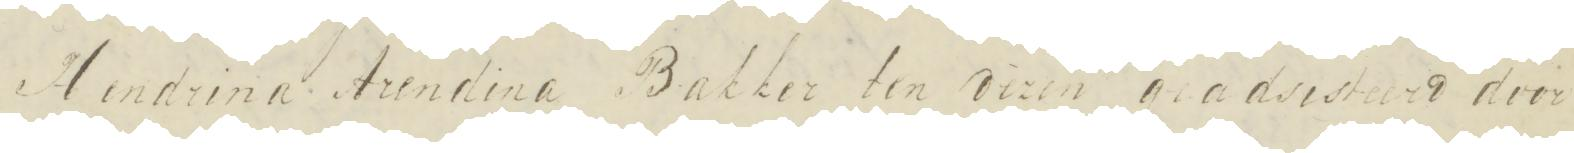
Hendrina Arendina Bakker ten dezen geadsisteerd door
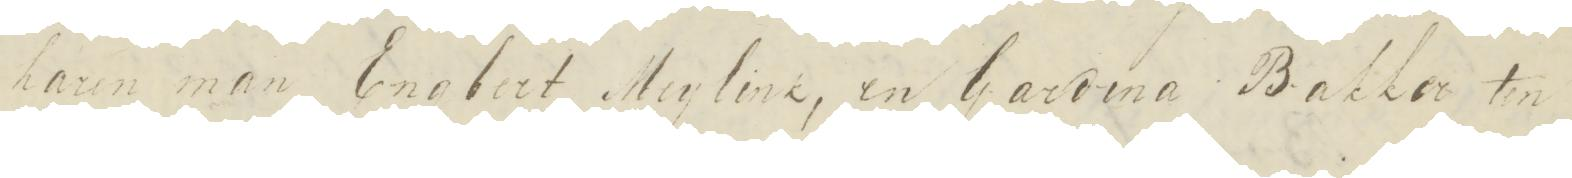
haren man Engbert Meylink, en Gardina Bakker ten
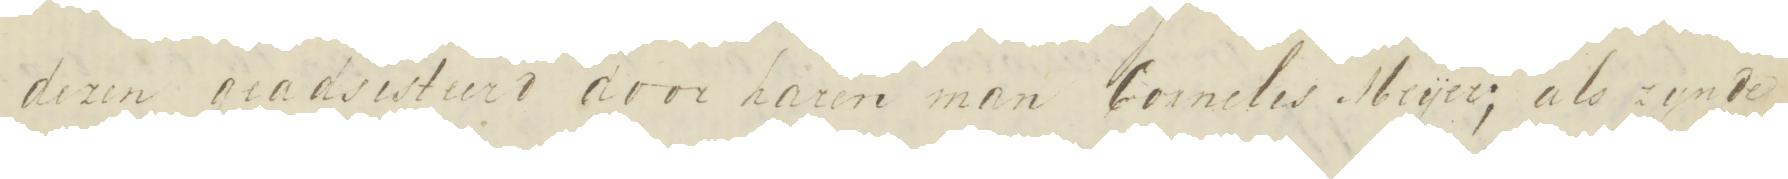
dezen geadsisteert door haren man Cornelis Meijer; als zynde
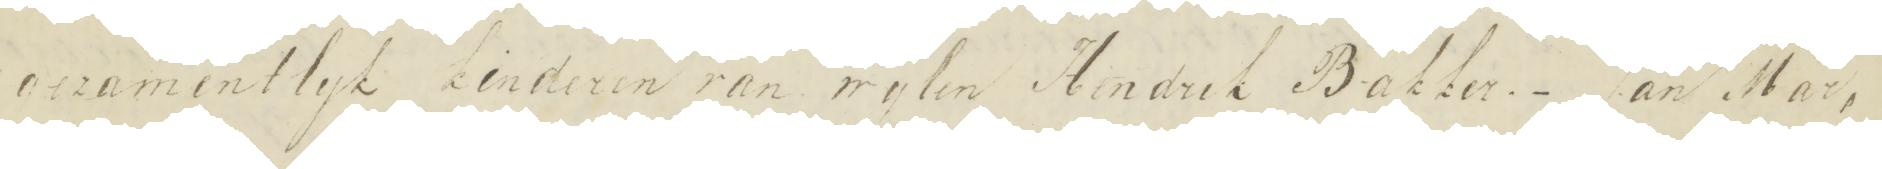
gezamentlyk kinderen van wylen Hendrik Bakker. - Jan Mar
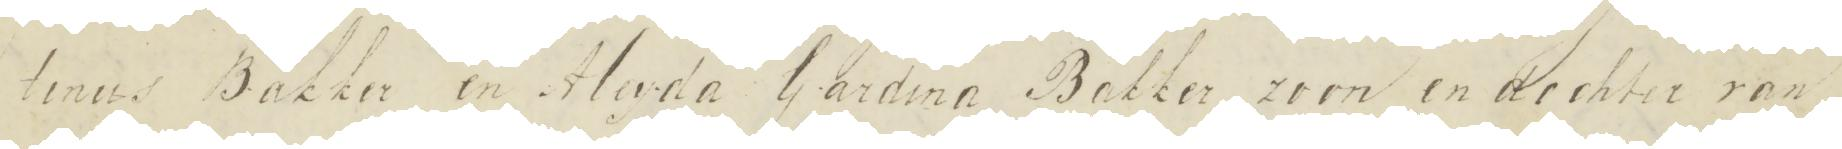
tinus Bakker en Aleyda Gardina Bakker, zoon en dochter van
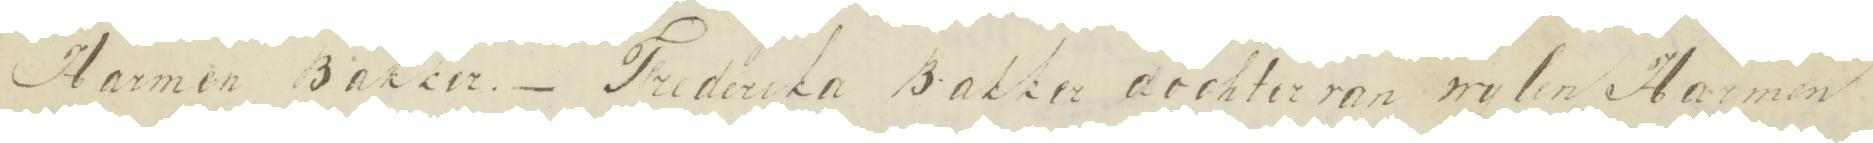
Harmen Bakker. — Frederika Bakker dochter van wylen Harmen
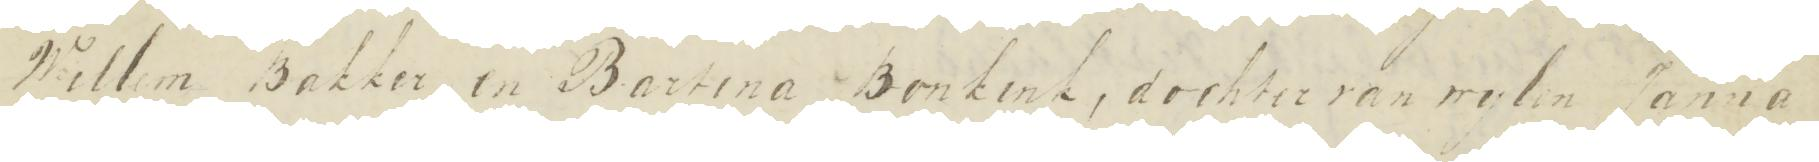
Willem Bakker, en Bartina Bonkink, dochter van wylen Janna
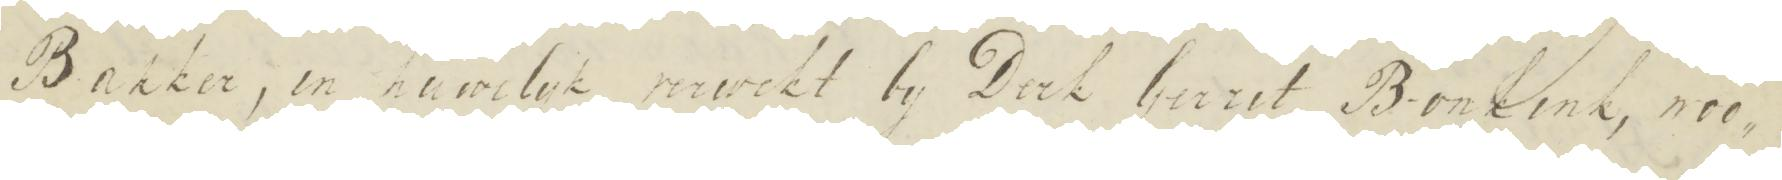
Bakker, in huwelyk verwekt by Derk Gerrit Bonkink, woo„
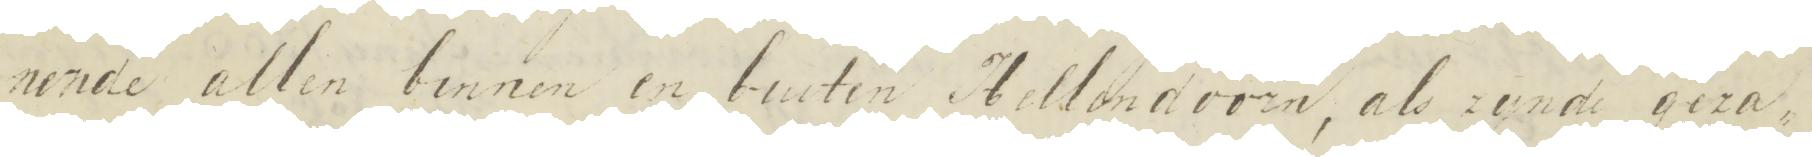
nende allen binnen en buiten Hellendoorn, als zynde geza„
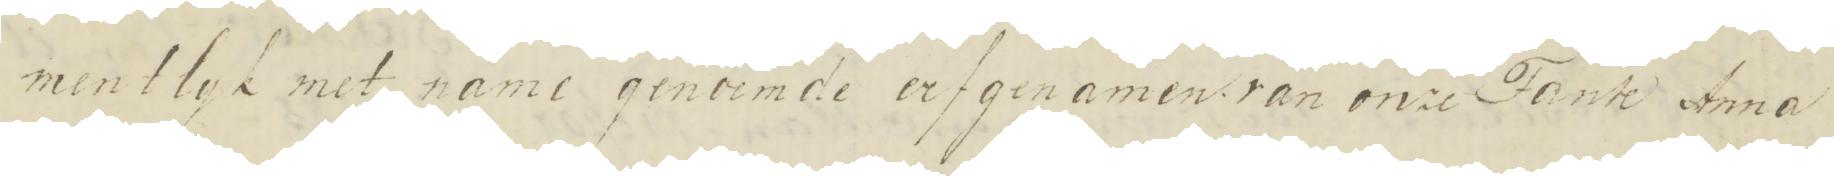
mentlyk met name genoemde erfgenamen van onze Tante Anna
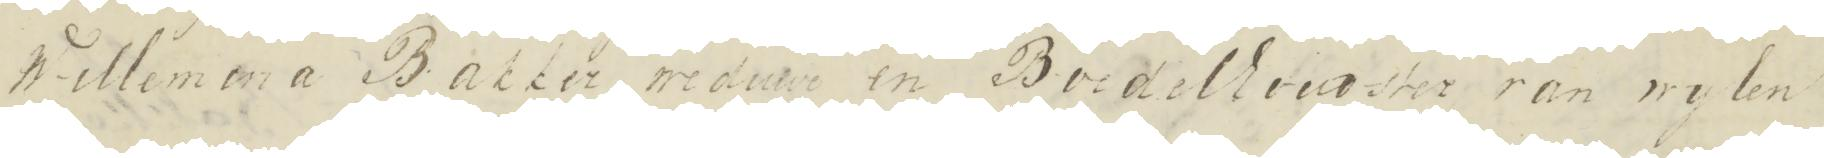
Willemma Bakker, weduwe en Boedelhoudster van wylen
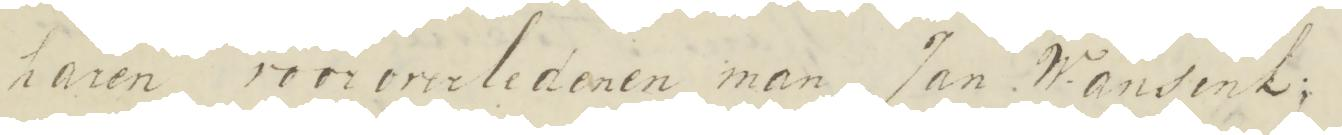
haren voor overledenen man Jan Wansink:
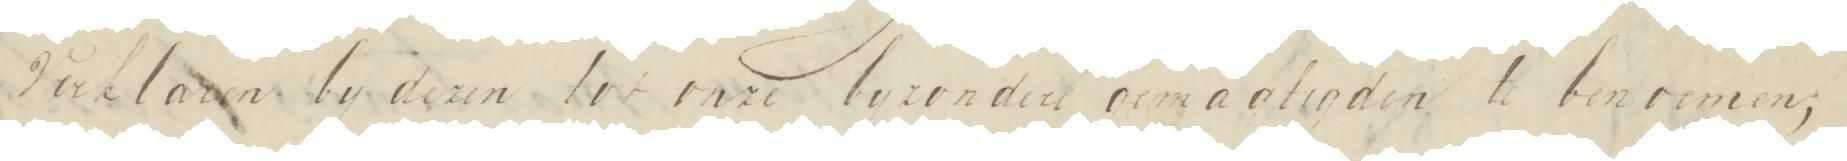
Verklaren by dezen tot onze byzonder gemaatigden te benoemen;
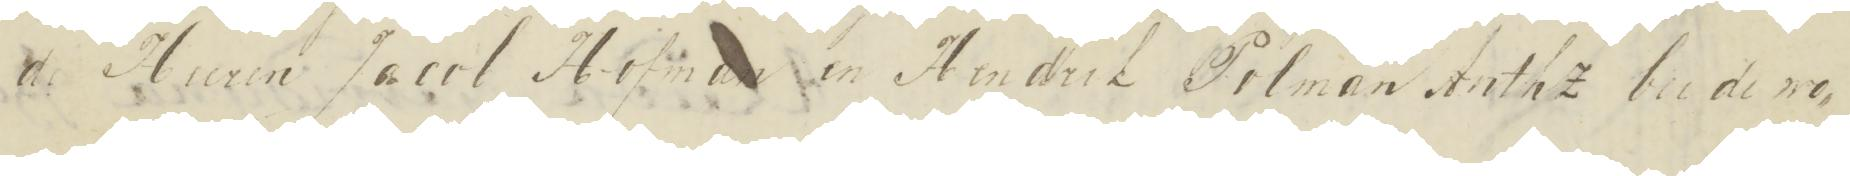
d. Heeren Jacob Hofman en Hendrik Polman Anthz beide wo„
